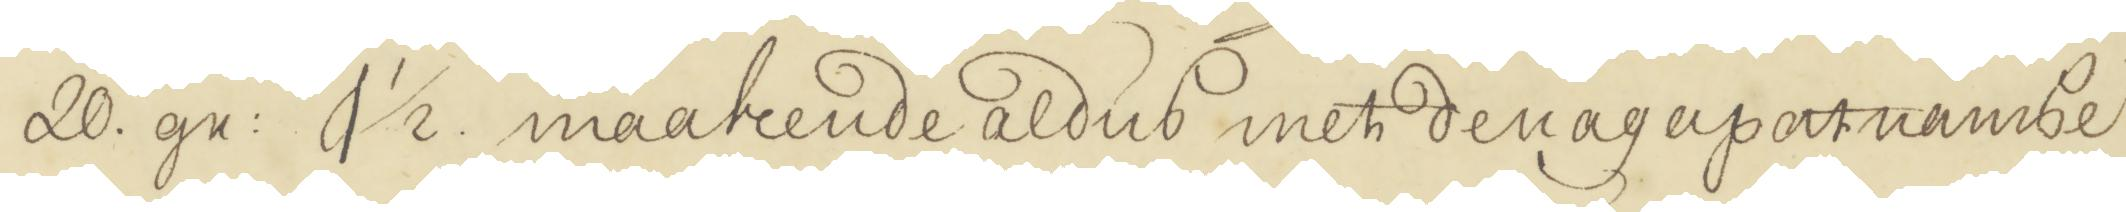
20. gr: 4½. maakende aldus met de nagapatnamse
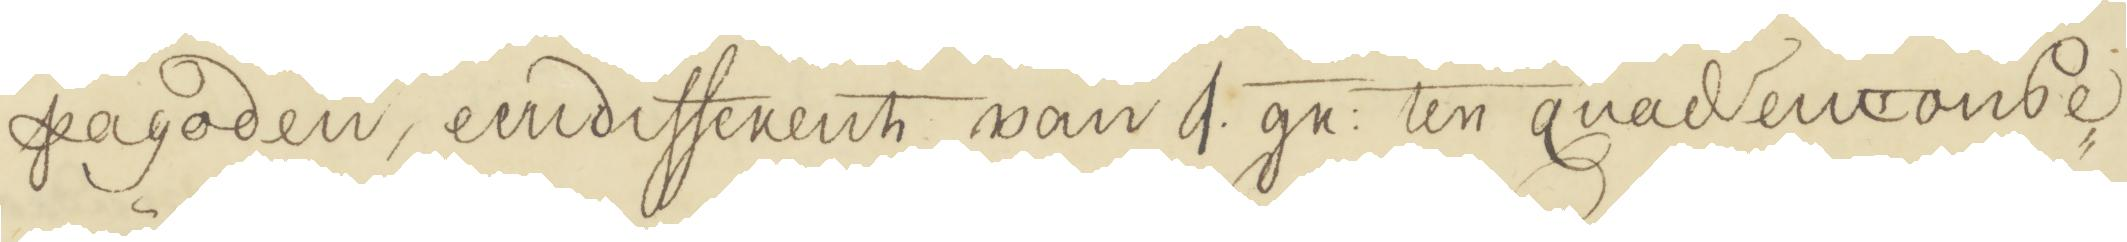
pagoden, een different van 4. gr: ten quaden conse„
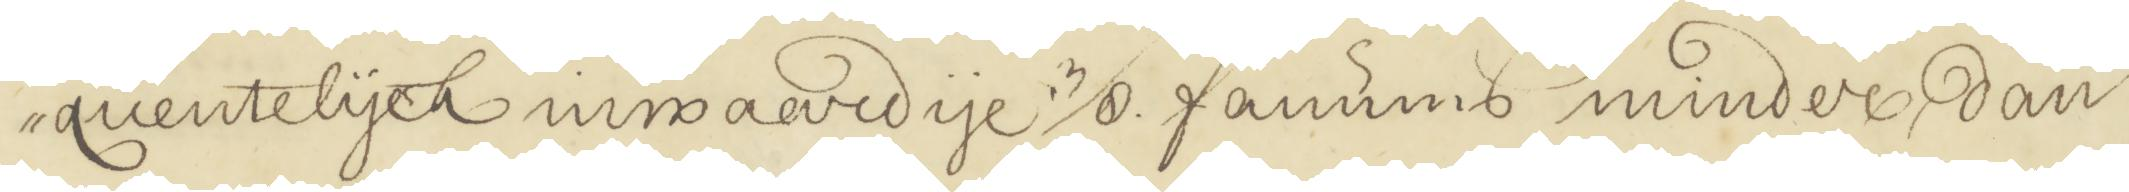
„quentelijck in waardije 3/8. fanums minder, dan
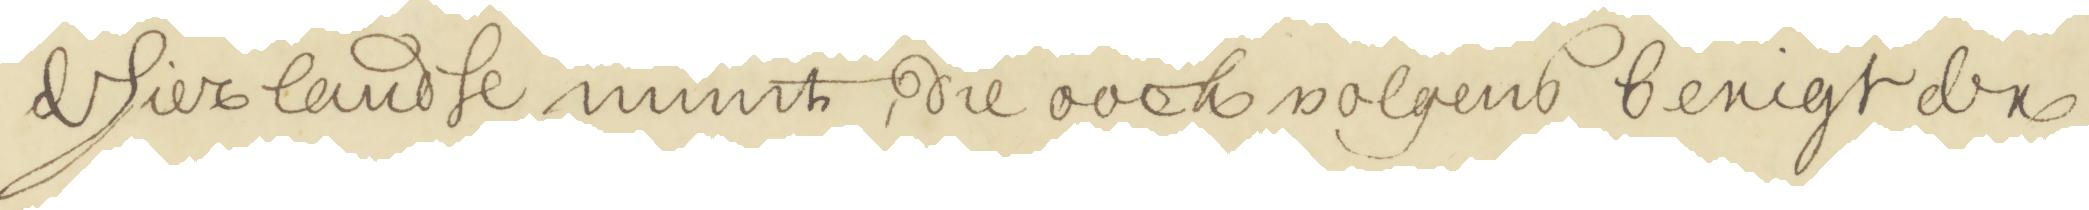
de hier landse munt, die oock volgens berigt der
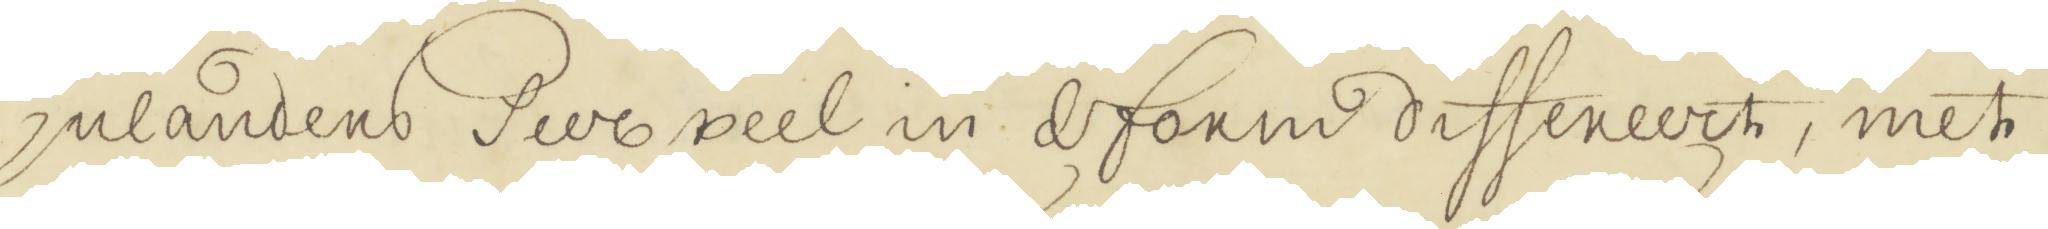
inlanders seer veel in de form differeert, met
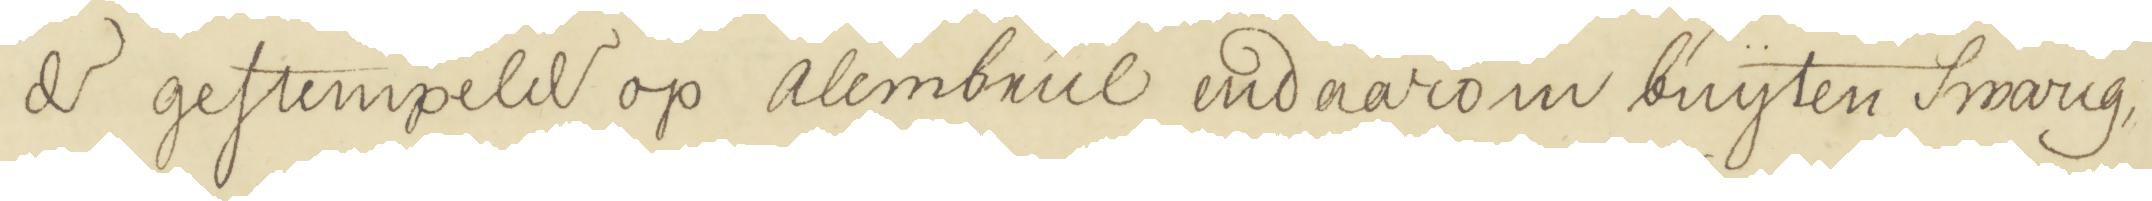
de gestempelde op alembrul en daarom buijten swarig„
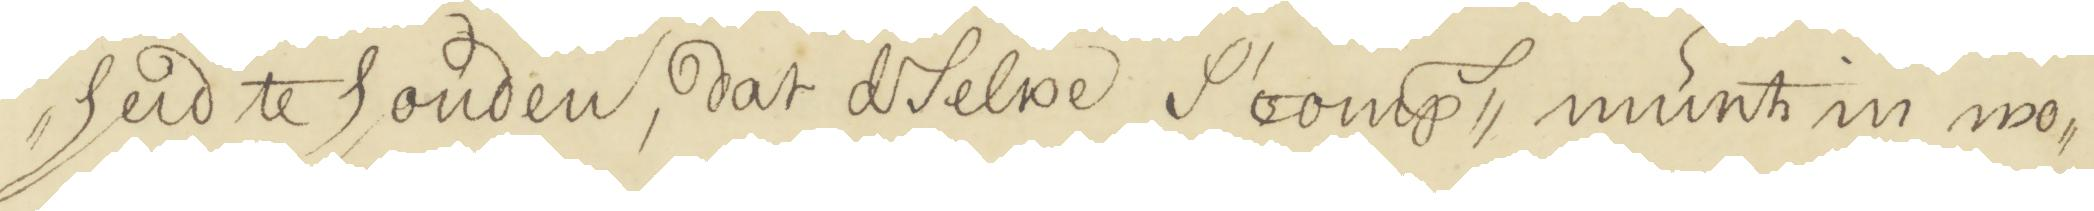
„heid te houden, dat deselve s'comp„s munt in wo„
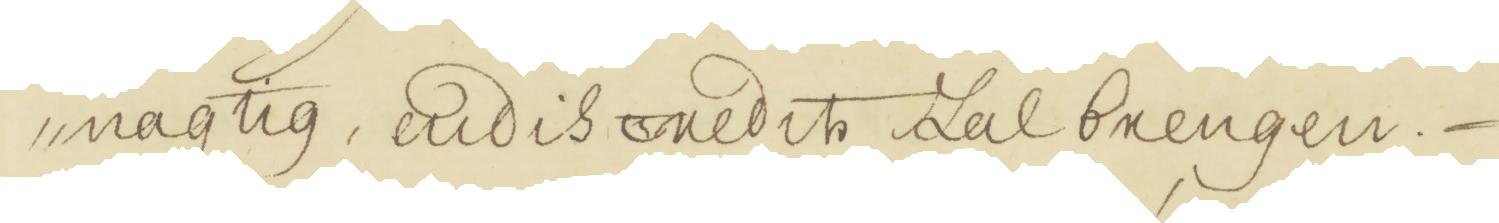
„nagtig, en discredit zal brengen. —
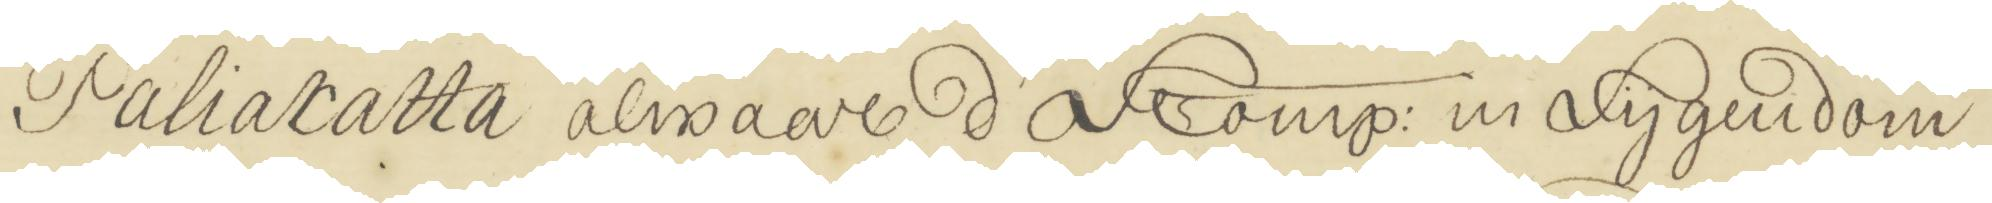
Paliacatta alwaar d'E Comp: in Eijgendom
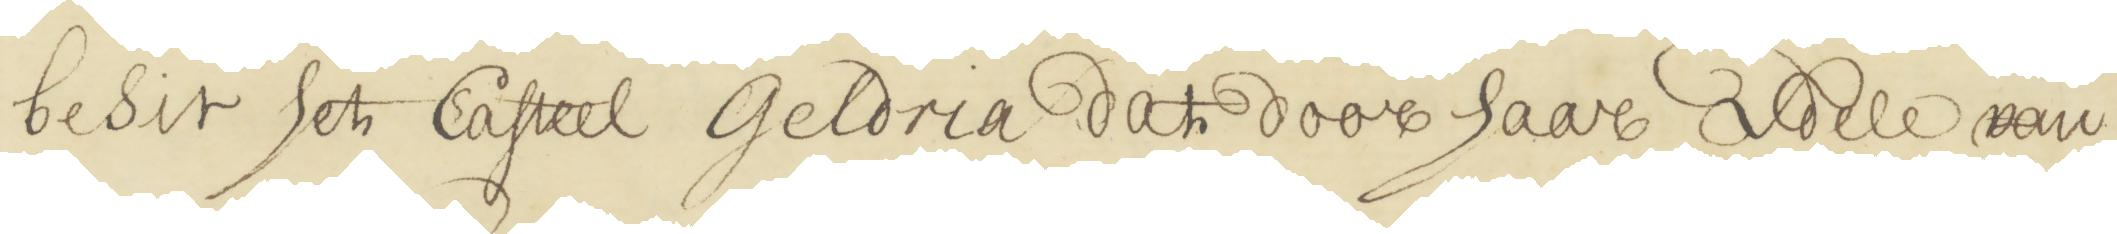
besit het Casteel Geldria dat door haar Edele van
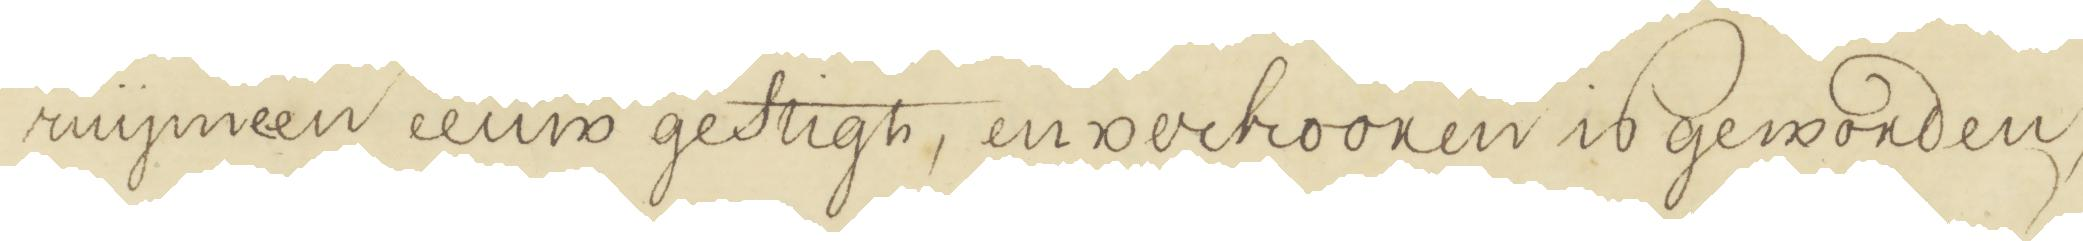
ruijm een eeuw gestigt, en verkooren is geworden
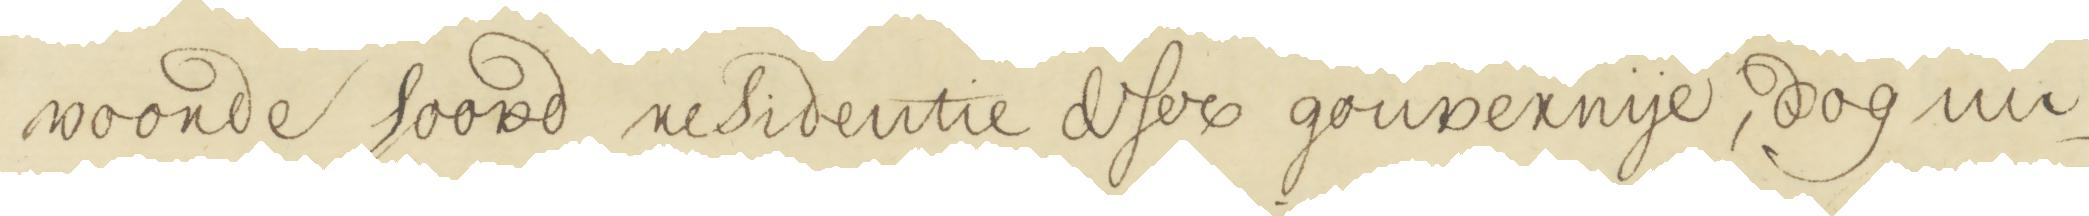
voorde hoovd residentie deser gouvernije, dog nu
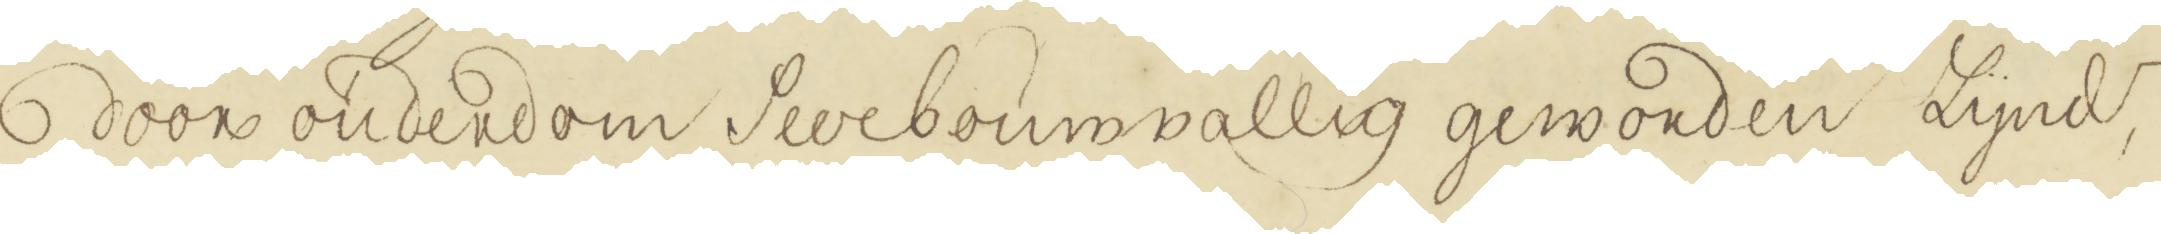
door ouderdom seer bouwvallig geworden zijnde,
